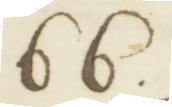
66.
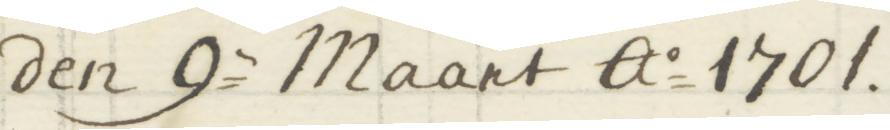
den 9=' Maart A=o 1701.
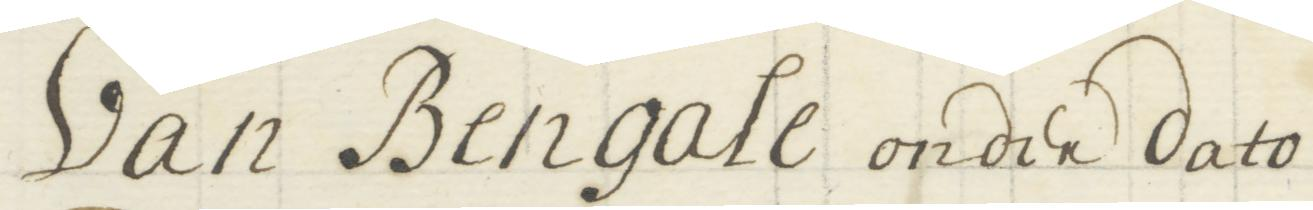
Van Bengale onder dato
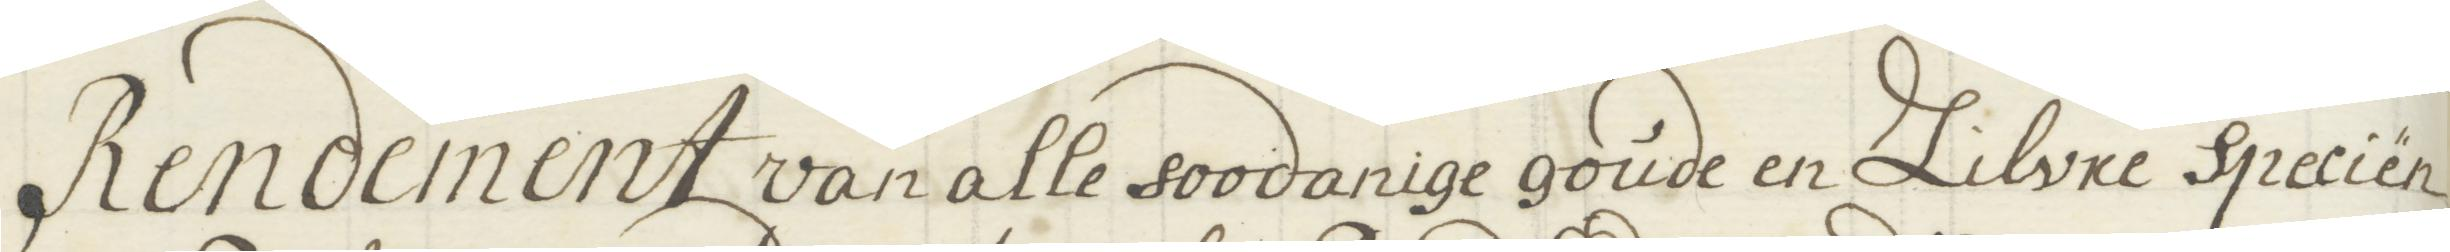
Rendement van alle soodanige goude en Zilvre Speciën
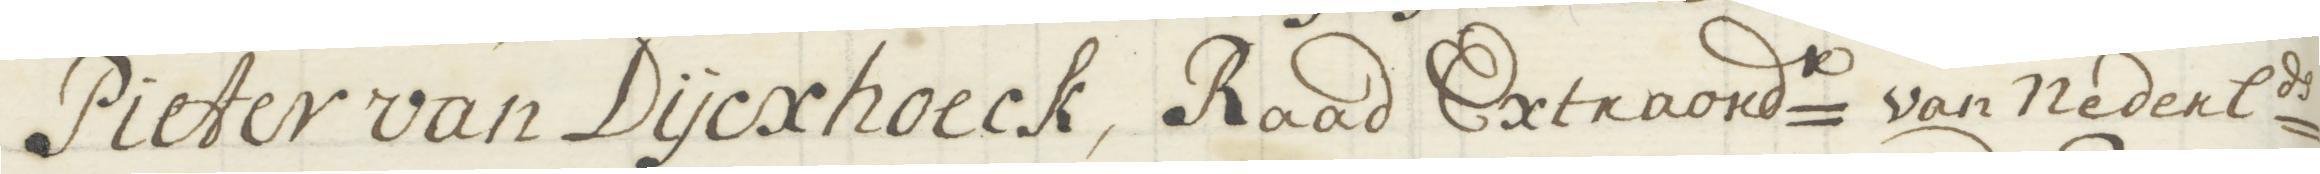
Pieter van Dijxhoeck, Raad Extraord=is van nederl=ds
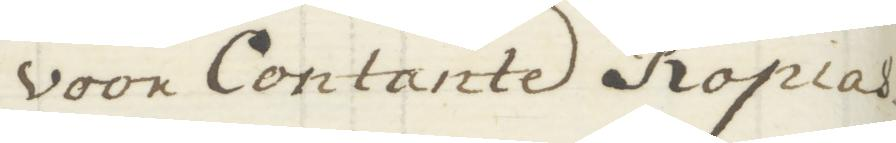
voor Contante Ropias
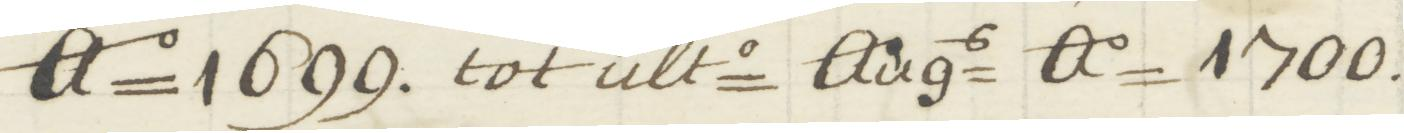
A=o 1699. tot ult=o Aug=s A=o 1700.
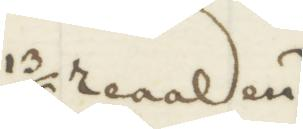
reaal en
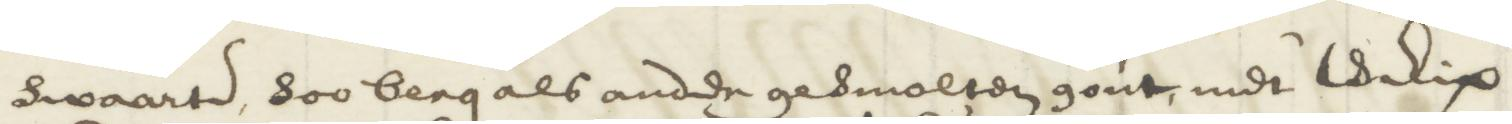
swaarte, soo berg als ander gesmolten gout, met 'tschip
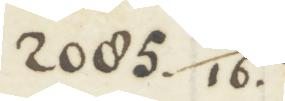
2085.13/16.
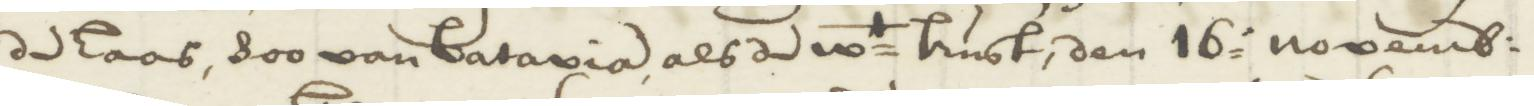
de haas, soo van batavia als de w=tkust, den 16=' novemb:
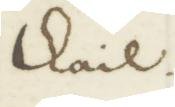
thail.
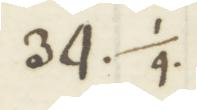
34.¼.
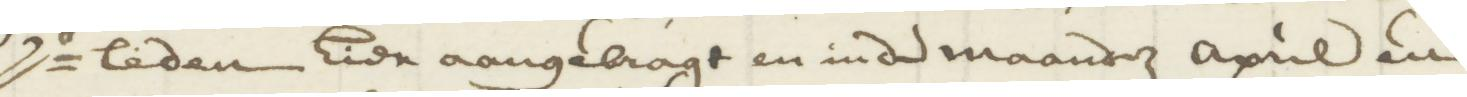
J=o leden hier aangebragt en in de maanden april en
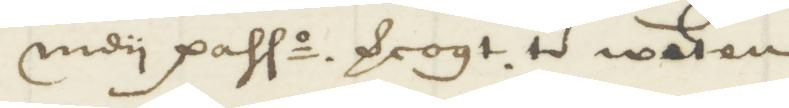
meij pass=o. vercogt. te weten:
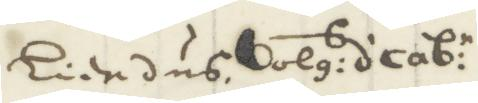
hier dus volg:s d'cab:'
